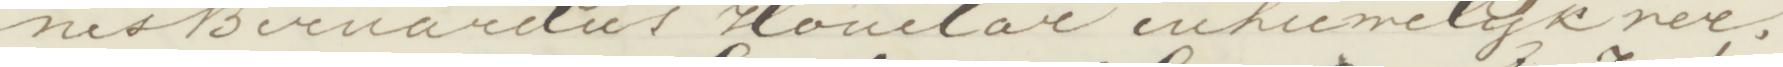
–nes Bernardus Honslar in huwelyk ver,
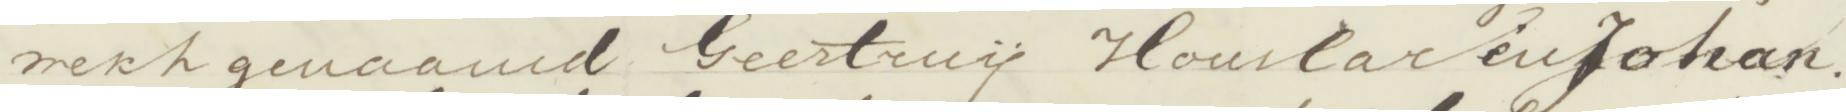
=wekt genaamd Geertruij Honslar en Johan.
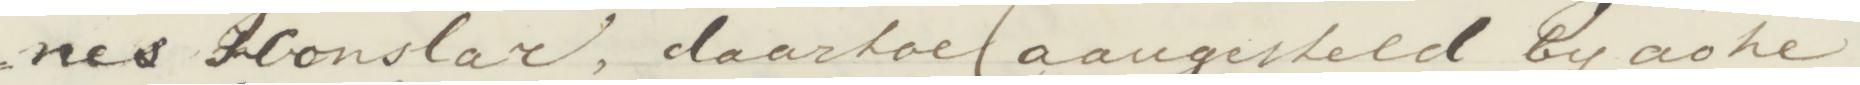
=nes Honslar, daartoe aangesteld by acte
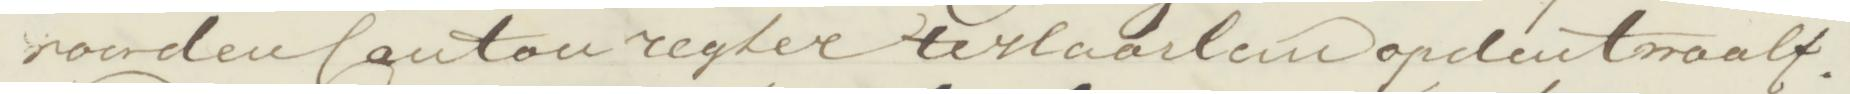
voor den Canton regter te Haarlem op den twaalf=
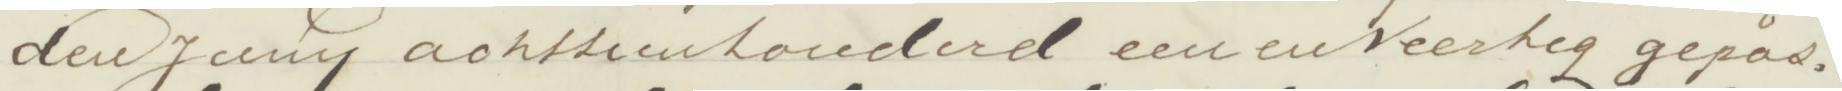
=den Juny achttienhonderd een en Veertig gepas=
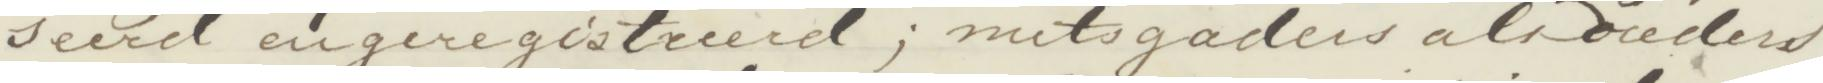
=seerd en geregistreerd; mitsgaders als ouders
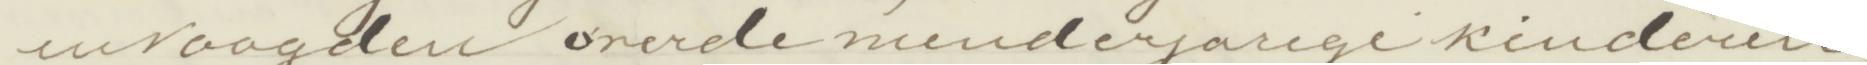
en voogden over de minderjarige kinderen
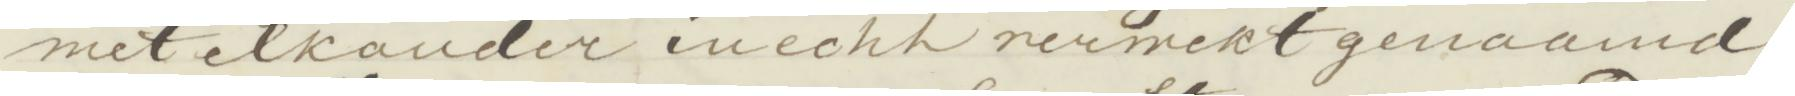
met elkander in echt verwekt genaamd
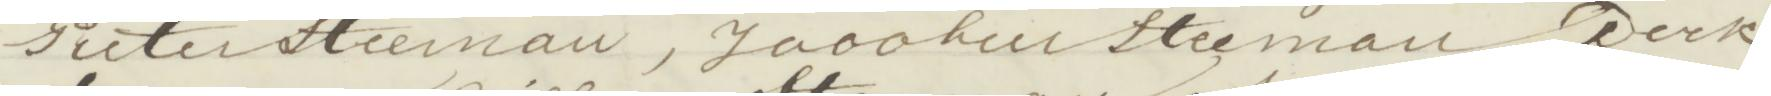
Pieter Heeman, Jacobus Heeman, Dirk
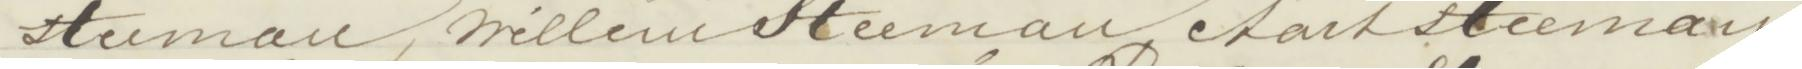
Heeman, willem Heeman, Aart Heeman
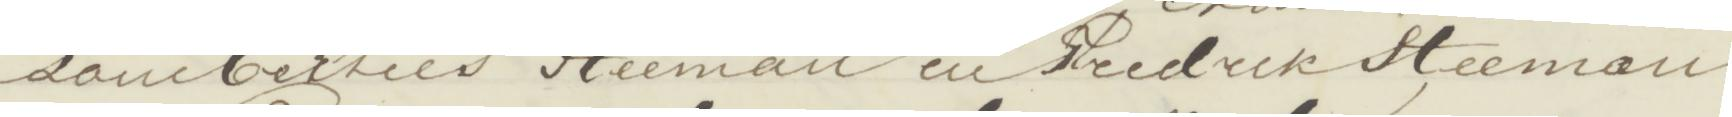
Lambertus Heeman en Fredrik Heeman
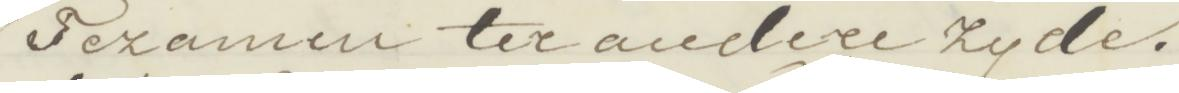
Tezamen ter andere zyde.
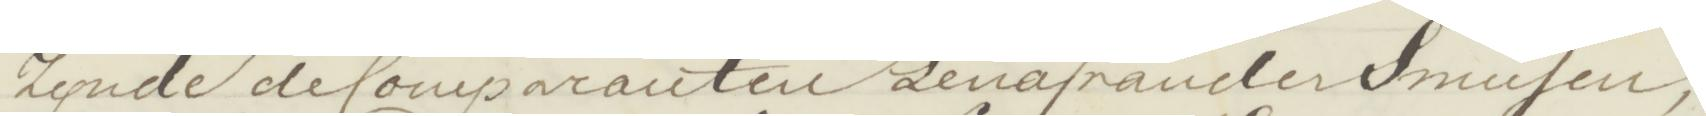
Zynde de Comparanten Lena van der Smissen,
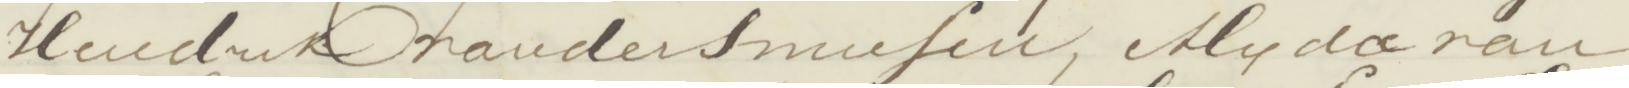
Hendrik van der Smissen, Alyda van
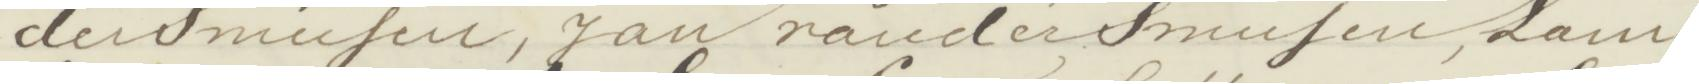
„ der Smissen, Jan van der Smissen, Lam,
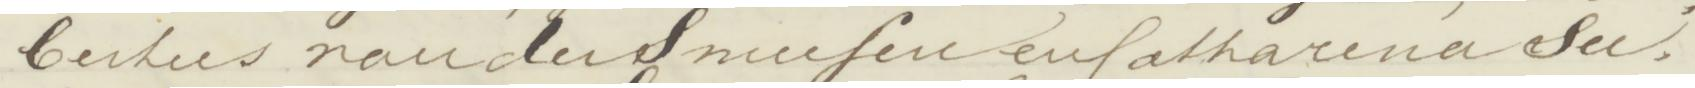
bertus van der Smissen en Catharina Su,
